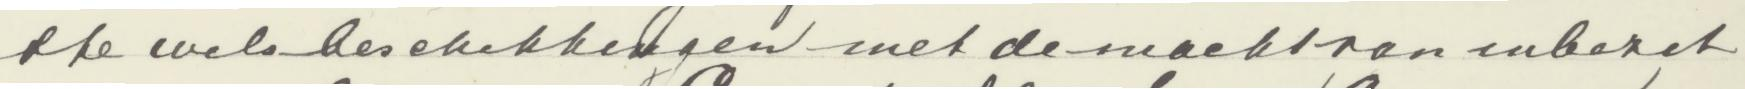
ste wils beschikkingen met de macht van inbezit
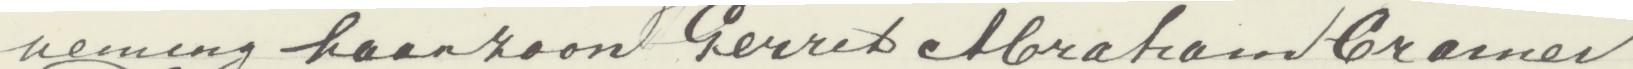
neming haar zoon Gerrit Abraham Cramer
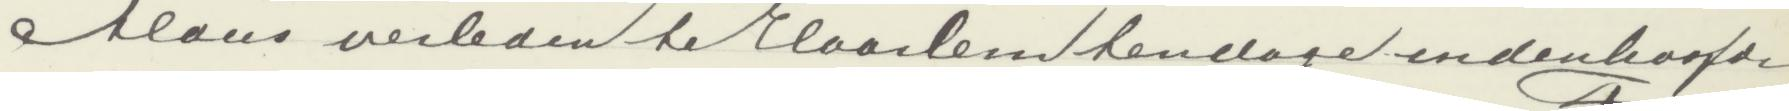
Aldus verleden te Haarlem ten dage in den hoofde
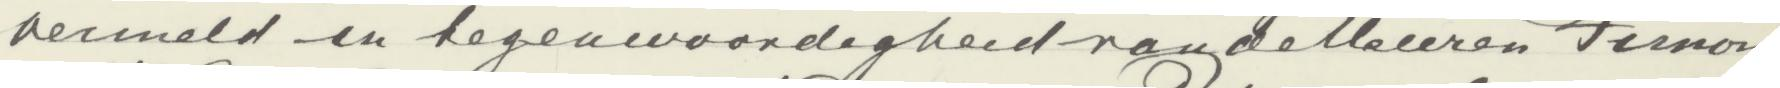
vermeld in tegenwoordigheid van de Heeren Timon
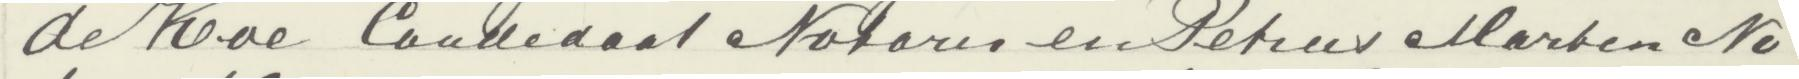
de Koe Candidaat Notaris en Petrus Marten No
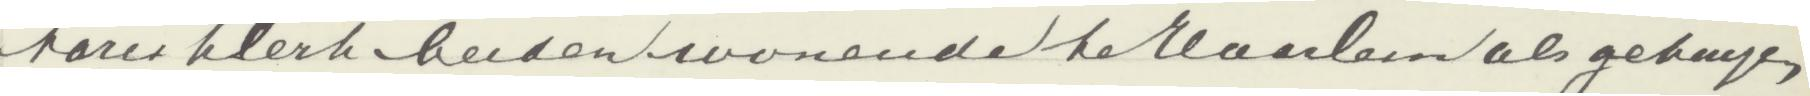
taris klerk beiden wonende te Haarlem als getuigen
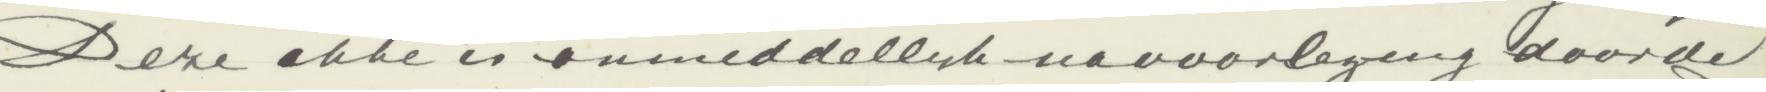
Deze akte is onmiddellyk na voorlezing door de
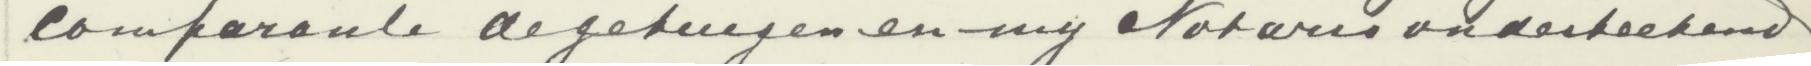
comparante de getuigen en mij Notaris onderteekend
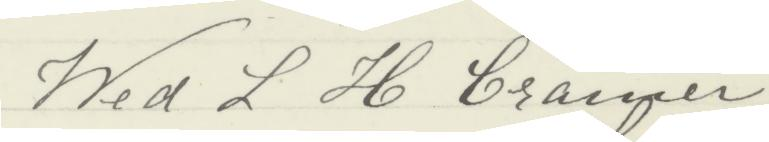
Wed L H Cramer
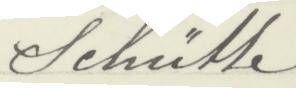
Schütte
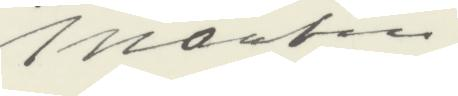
Martin
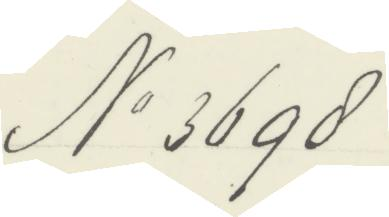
No 3698
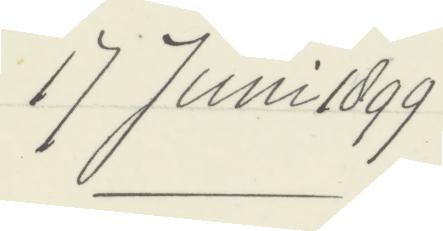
17 Juni 1899
